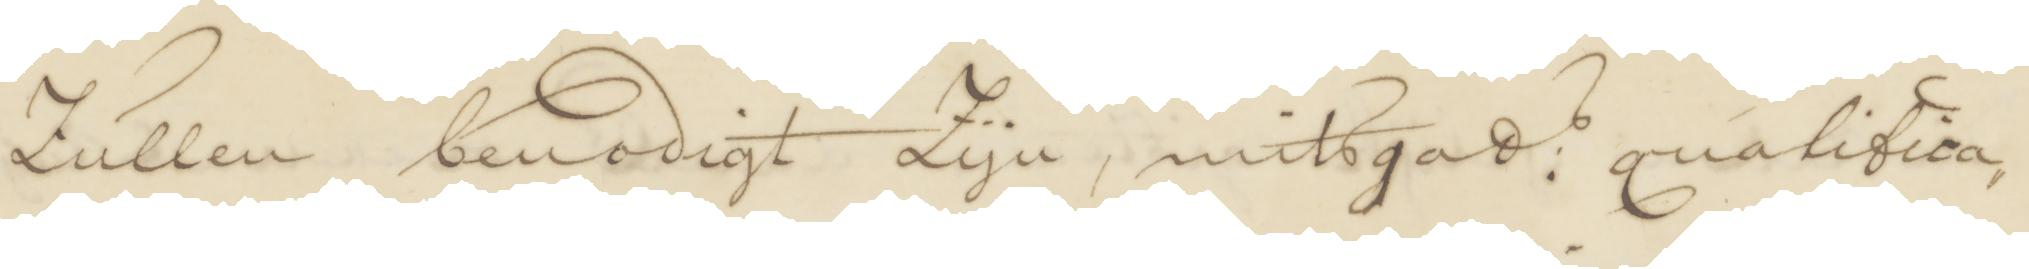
zullen benodigt zijn, mitsgad:s qualifica„
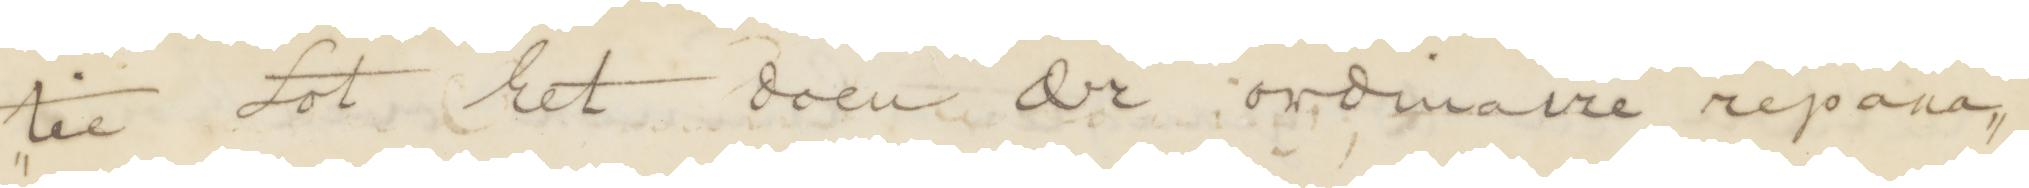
„tie tot het doen der ordinaire repara„
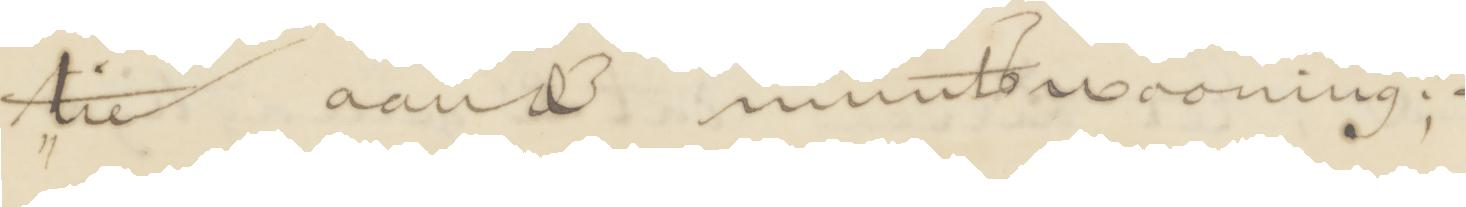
„tie aan de muntswooning;
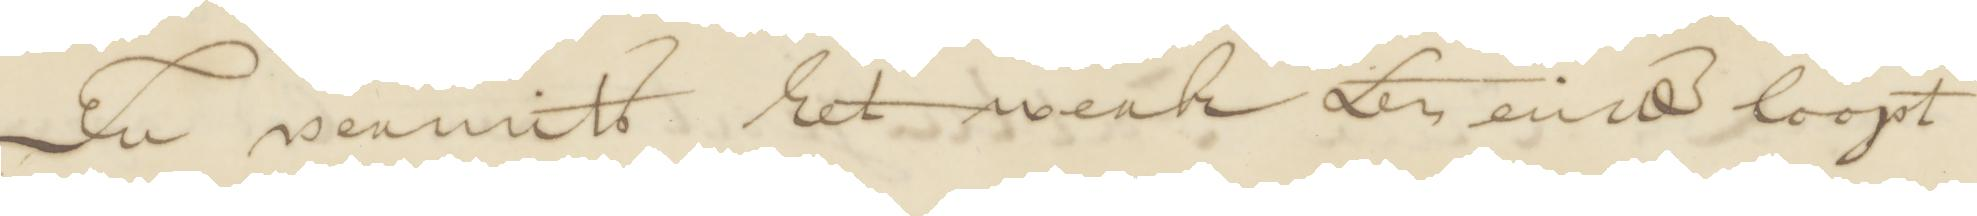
En vermits het werk ten einde loopt
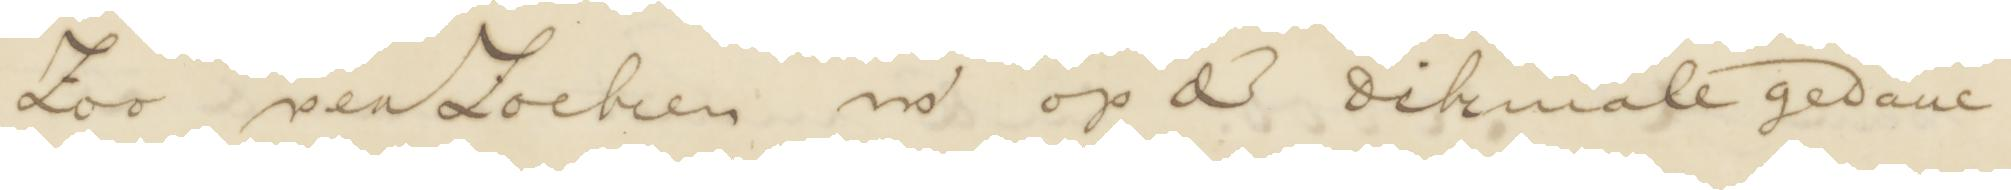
Zoo verzoeken w' op de dikmale gedane
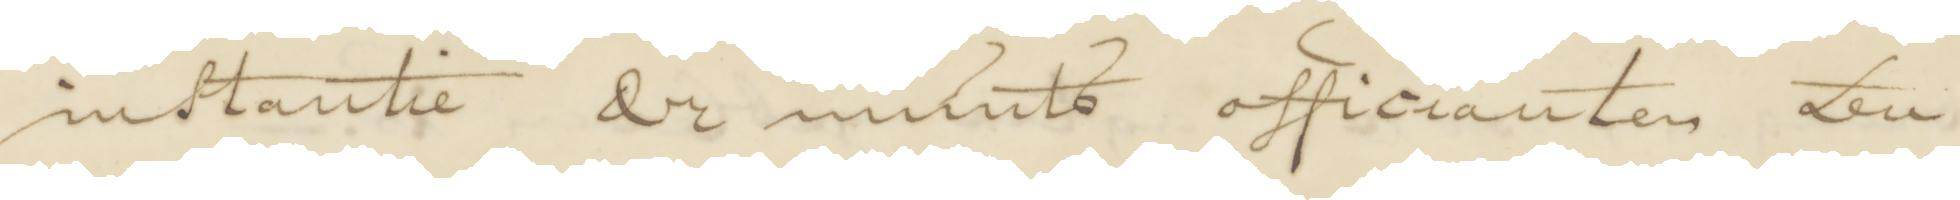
instantie der munts officianten ten
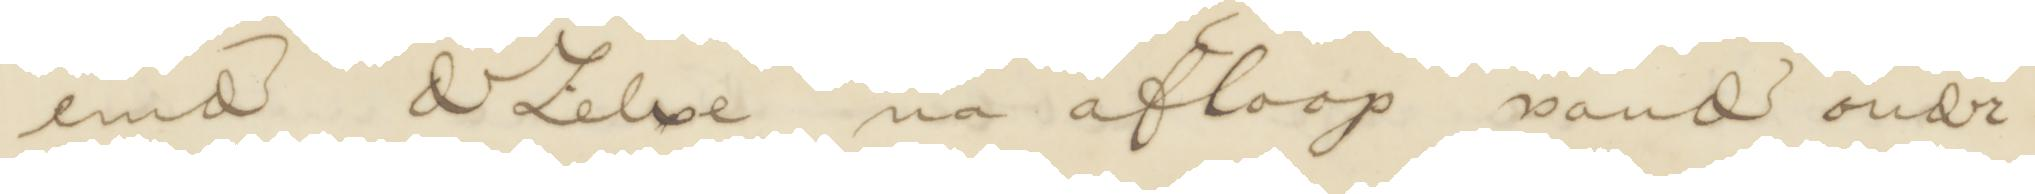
einde dezelve na afloop van de onder
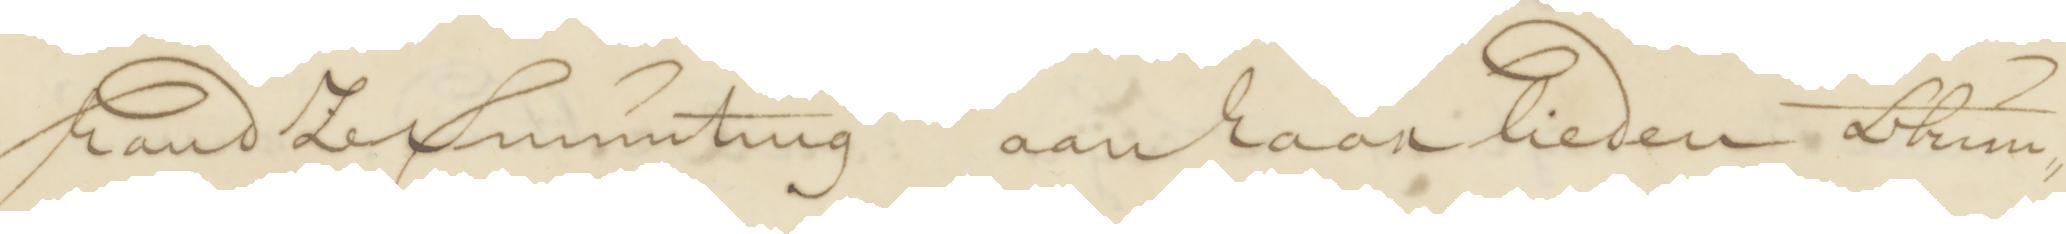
handze vermunting aan haar lieden te kun„
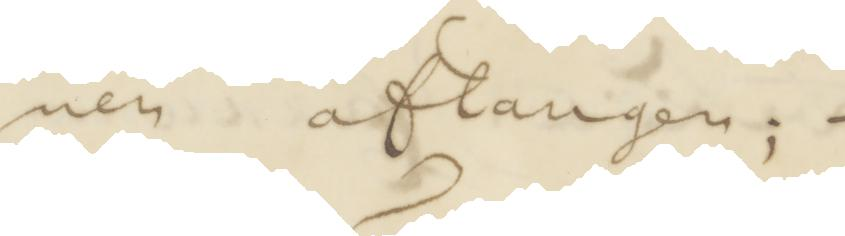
nen aflangen; —
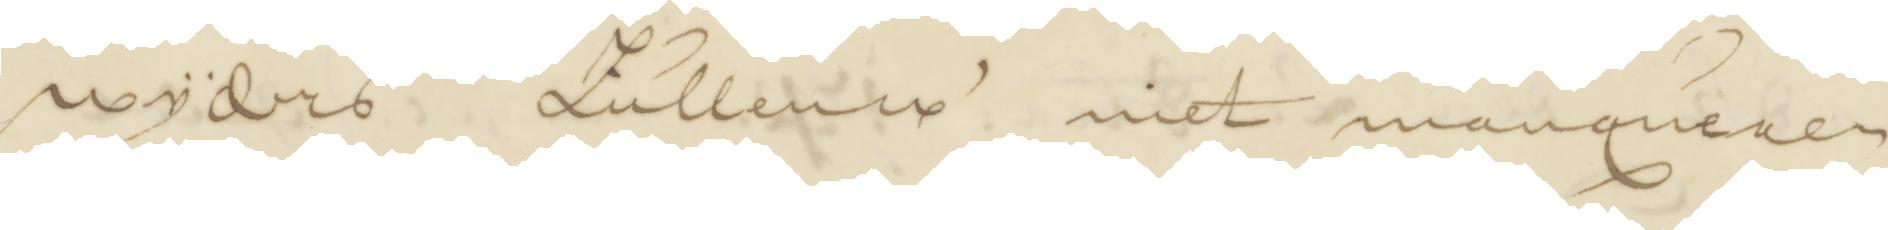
wijders Zullen w' niet manqueren
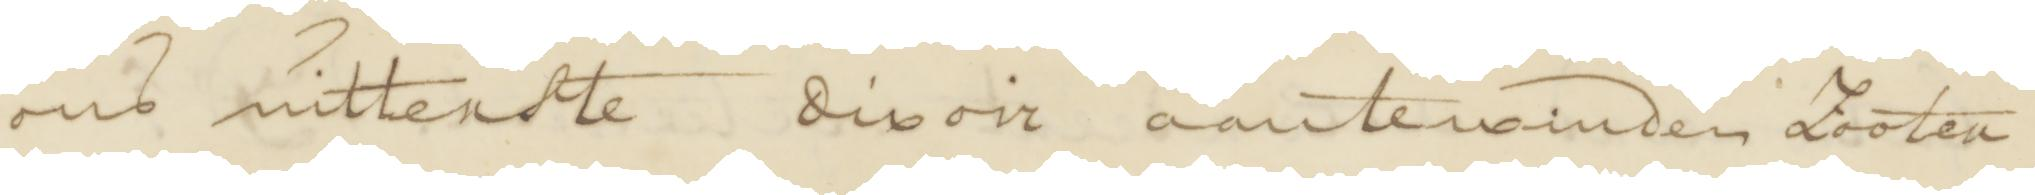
ons uitterste divoir aan te winden Zoo ter
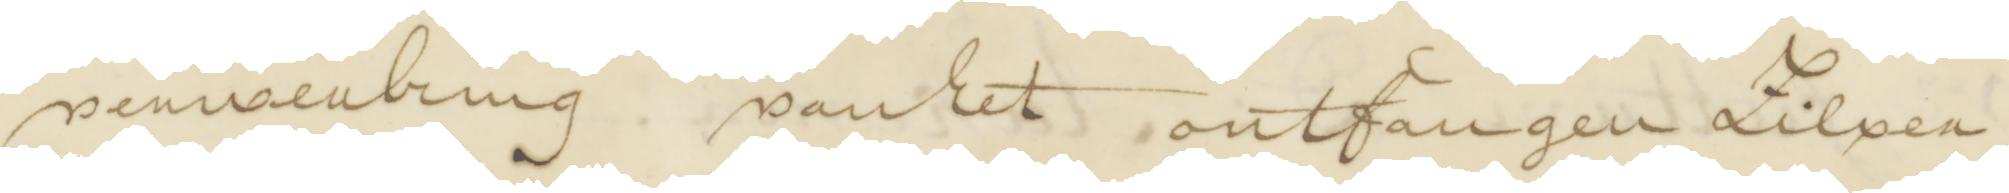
verwerking van het ontfangen Zilver
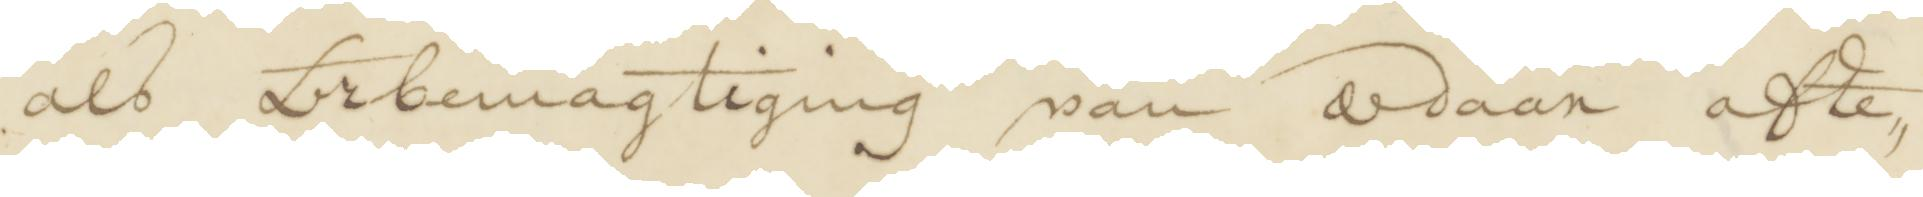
als ter bemagtiging van de daar af te„
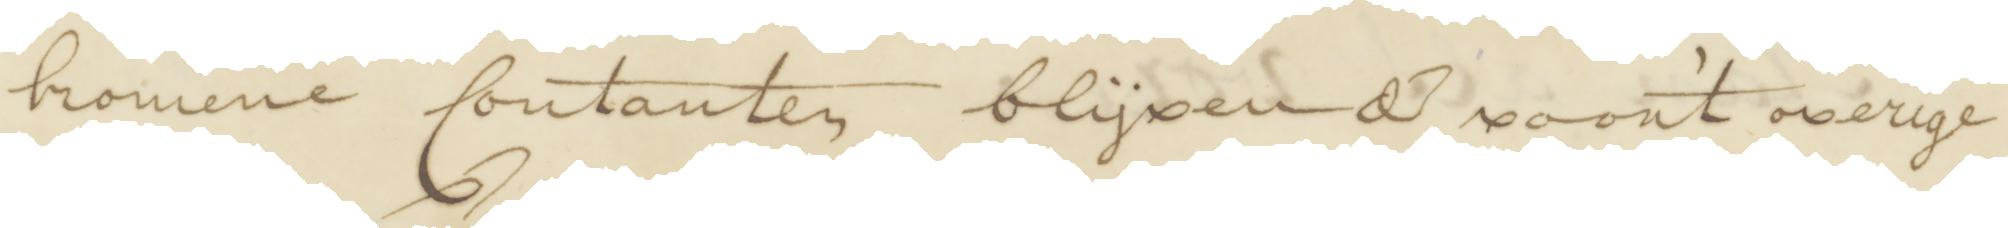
komene Contanten blijven de voor 't overige
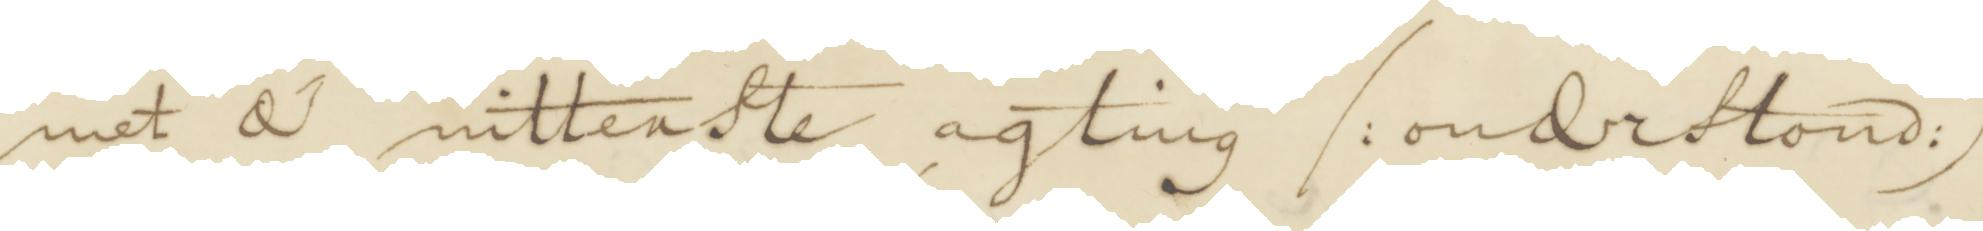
met de uitterste agting /:onder stond:)
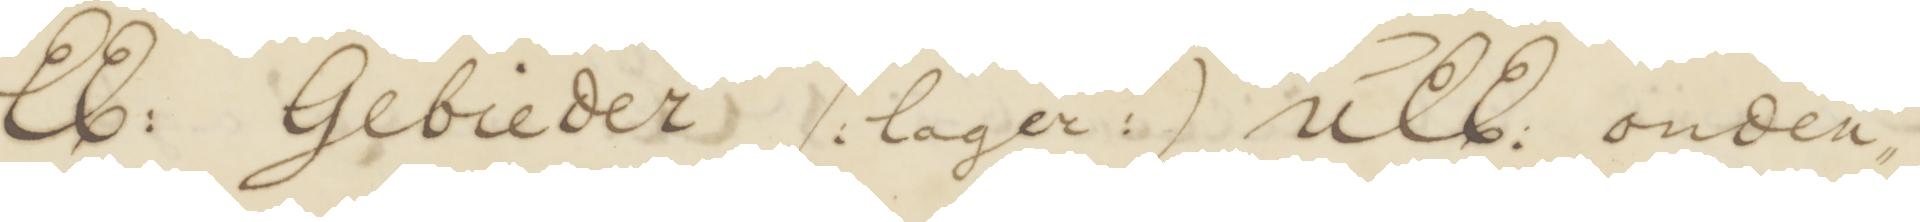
EE: Gebieder /:lager:) uEE: onder„
